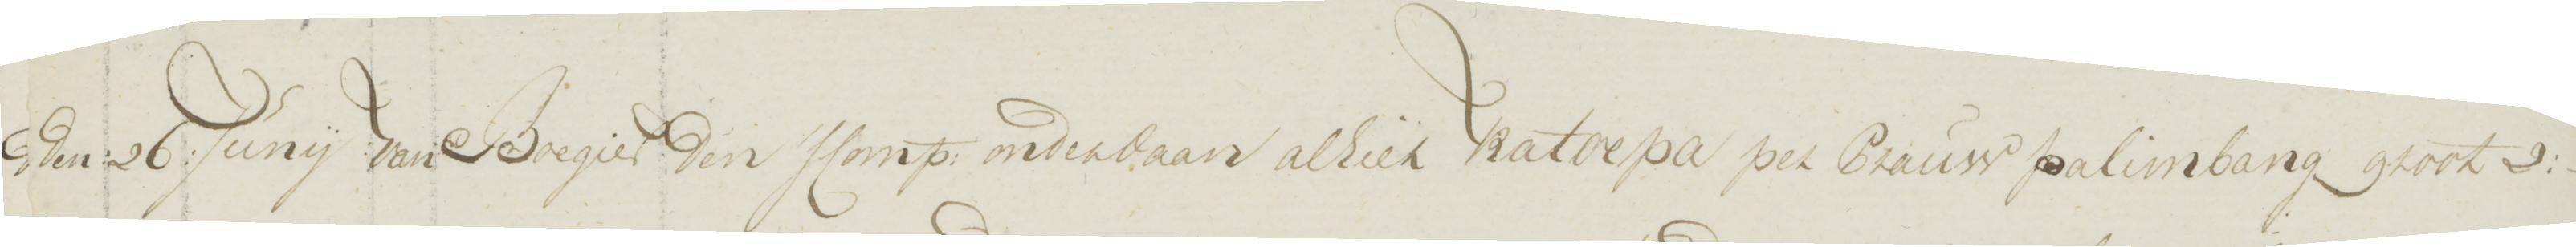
den: 26: Junij van Boegies den 'sComp: onderdaan alhier katoepa per Prauw palimbang groot 2:
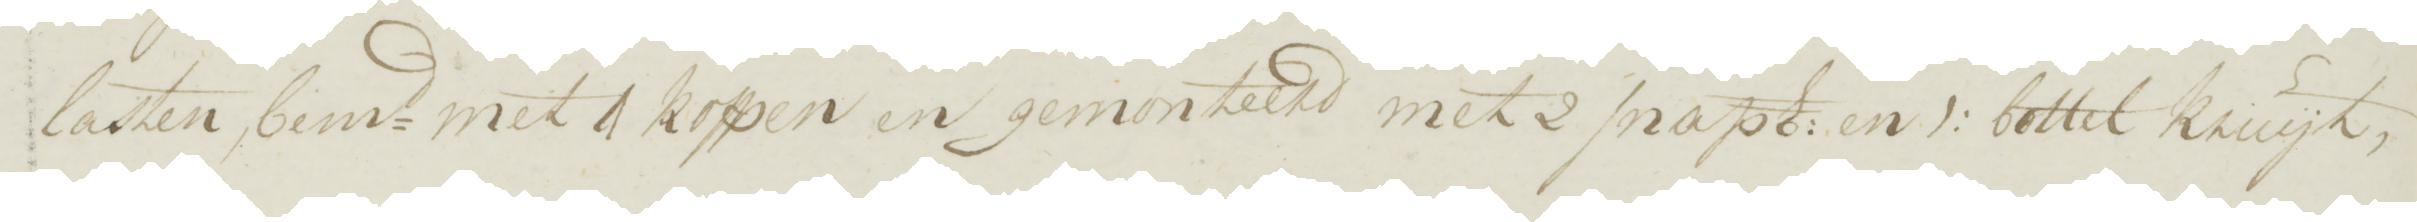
lasten, bem=d met 4 koppen en gemonteerd met 2 snaph: en 1: bottel kruijt,
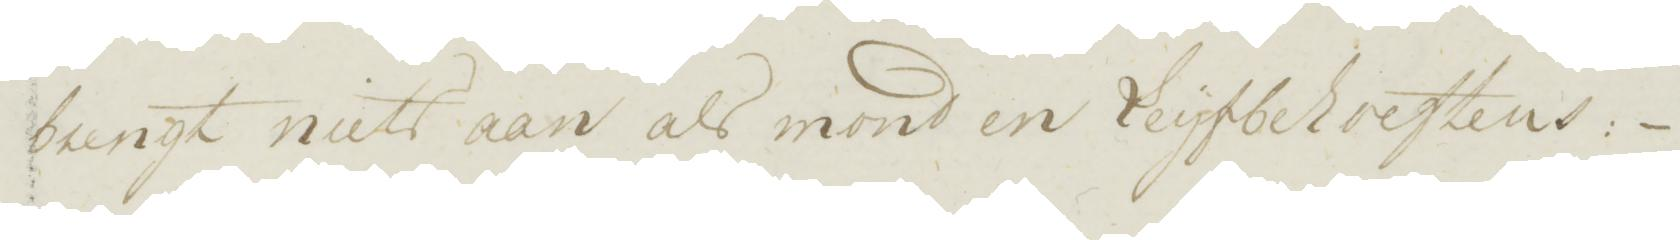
brengt niets aan als mond en Leijfbehoeftens: –
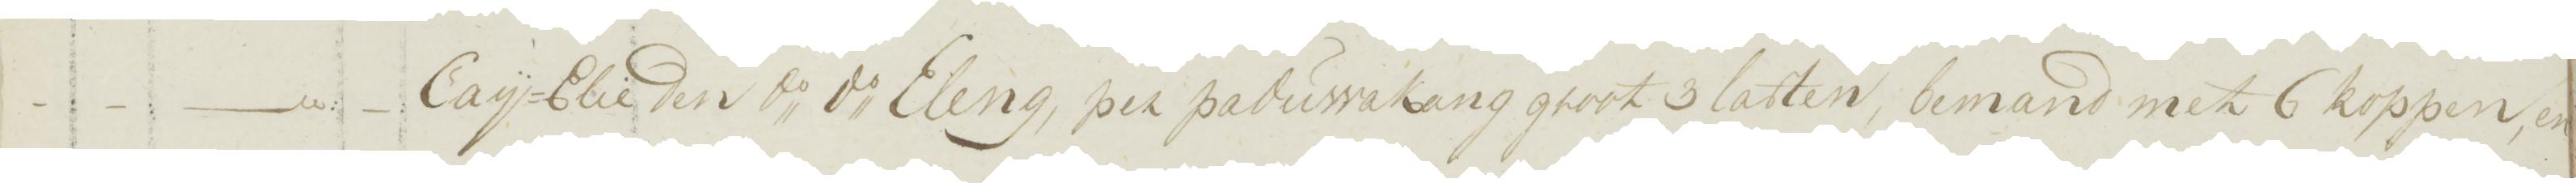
- : - : _o: — : Caij=Elie den d„o d„o Eleng, per paduwakang groot 3 lasten, bemand met 6 koppen, en
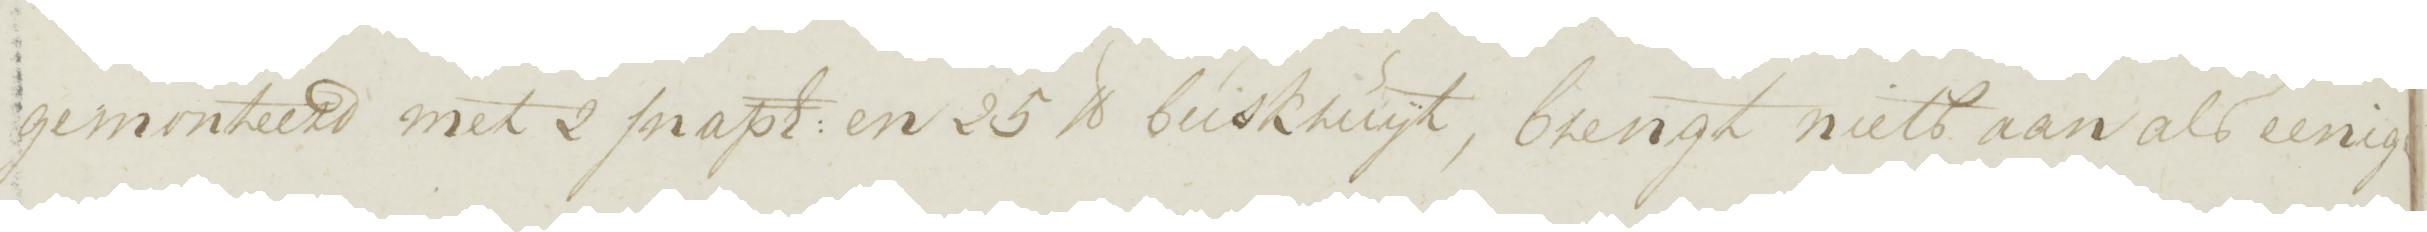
gemonteerd met 2 snaph: en 25 lb buskruijt, brengt niets aan als eenig
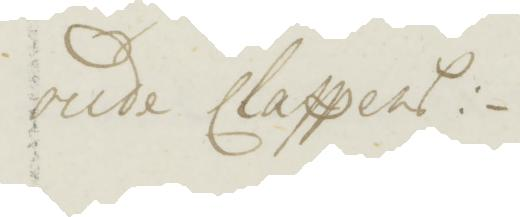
oude Clappers: -
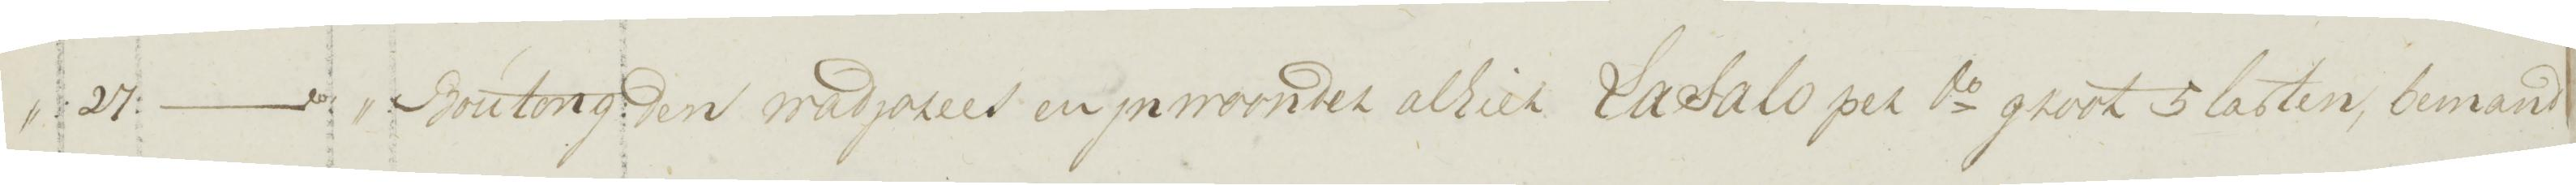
„ : 27: _o: „ Boutong: den wadjorees en jnwoonder alhier Lasalo per d=o groot 5 lasten, bemand
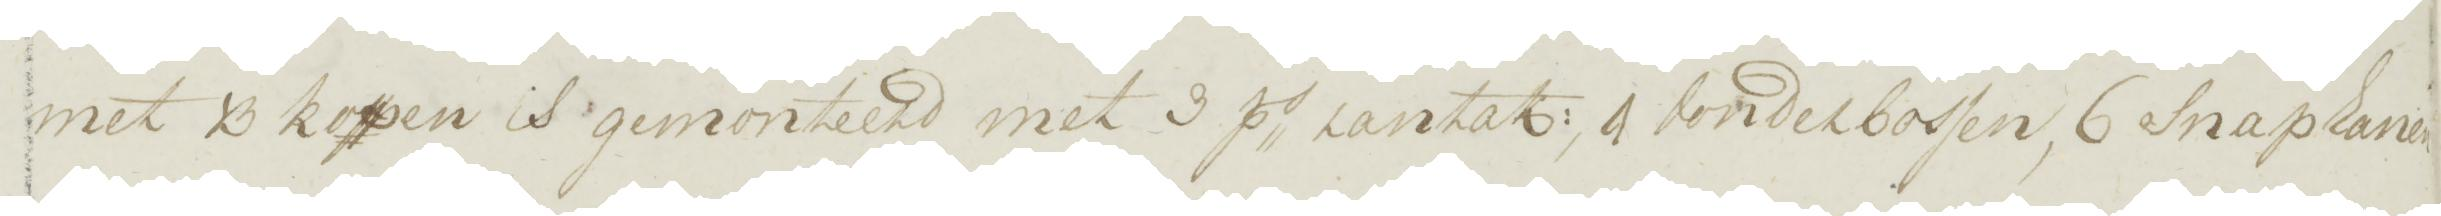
met 13 koppen is gemonteerd met 3 p„s rantak:, 4 donderbossen, 6 snaphane
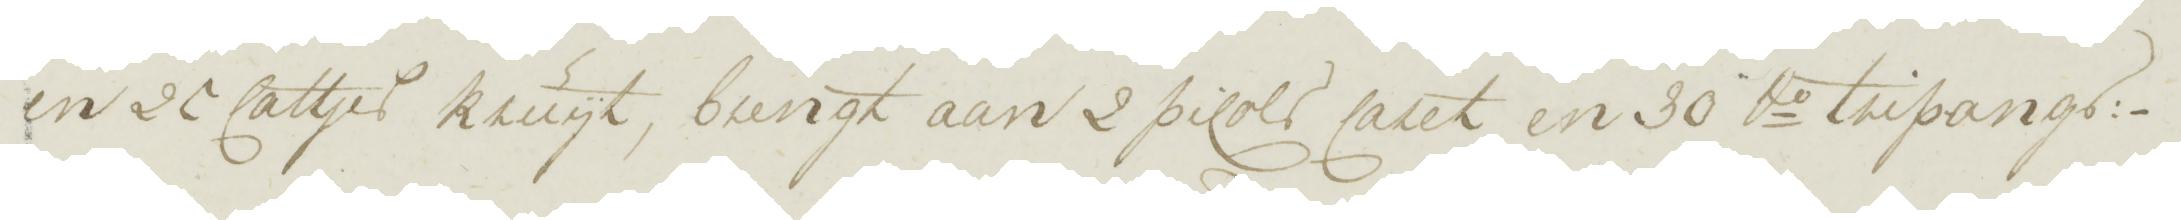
en 25 Cattjes kruijt, brengt aan 2 picols Caret en 30 d=o tripangs: -
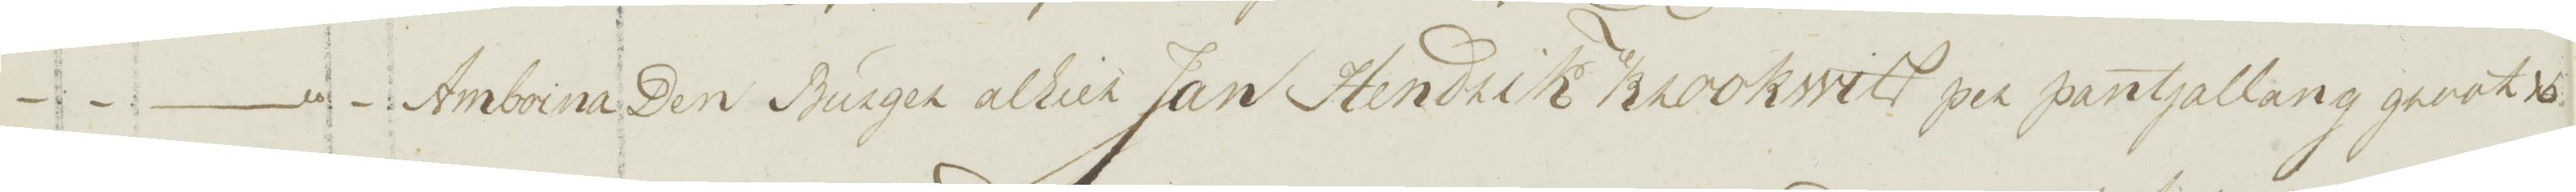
— : — : _o: — : Amboina Den Burger alhier Jan Hendrik Krookwith per pantjallang groot 15
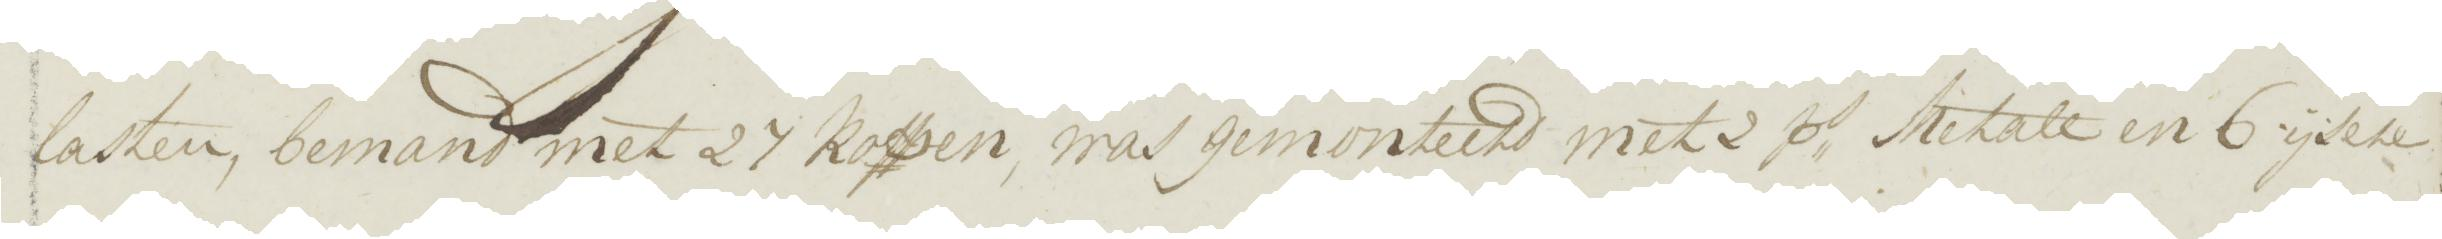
lasten, bemand met 27 koppen, was gemonteerd met 2 p„s Metale en 6 ijsere
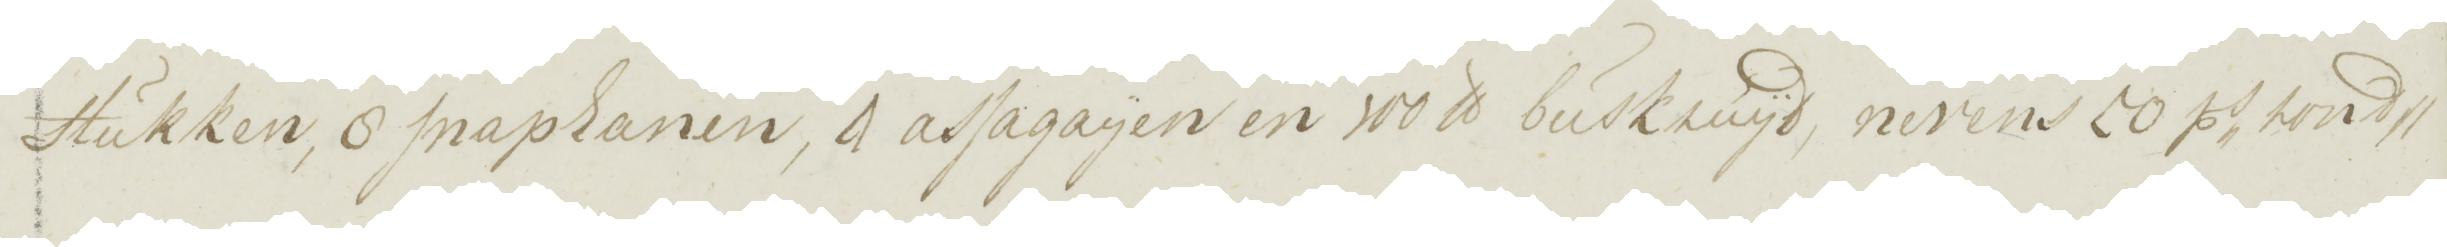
stukken, 8 snaphanen, 4 assagaijen en 100 lb buskruijd, nevens 50 p„s rond„
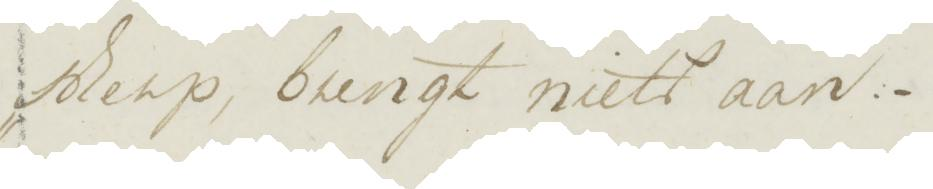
„scherp, brengt niets aan: -
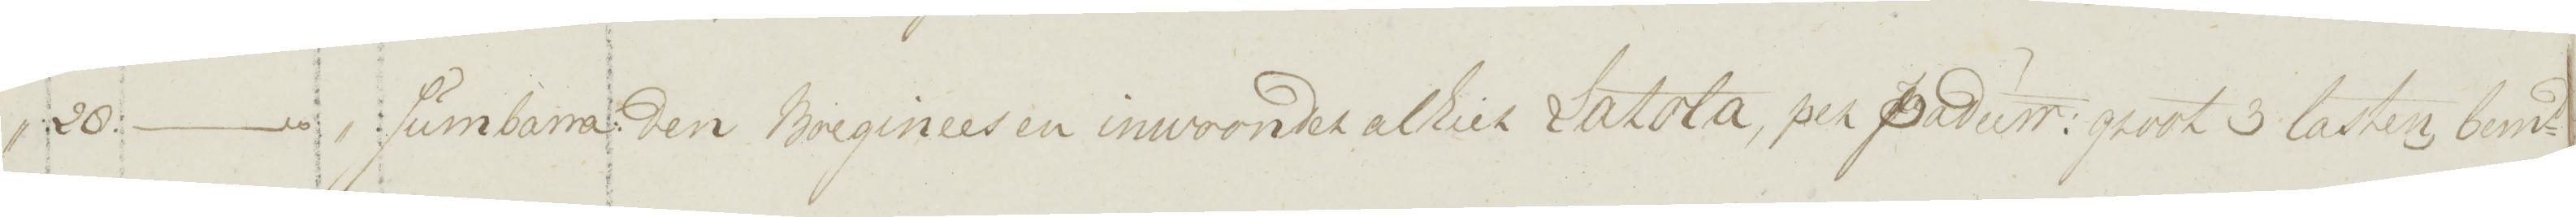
„:28: _o: „ : sumbawa: den Boeginees en inwoonder alhier Latola, per paduw: groot 3: lasten, bem=d
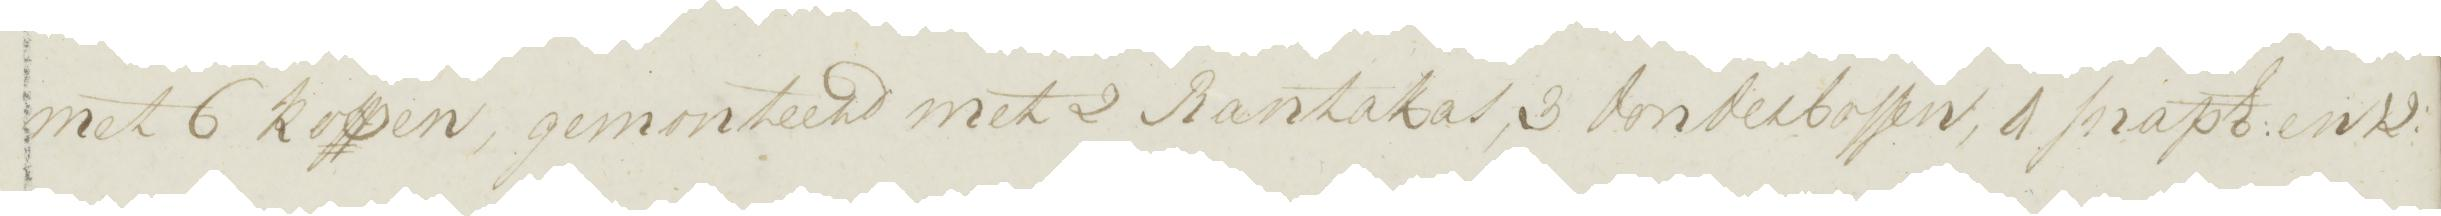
met 6 koppen, gemonteerd met 2 Rantakas, 3 donderbossen, 4 snaph: en 12:
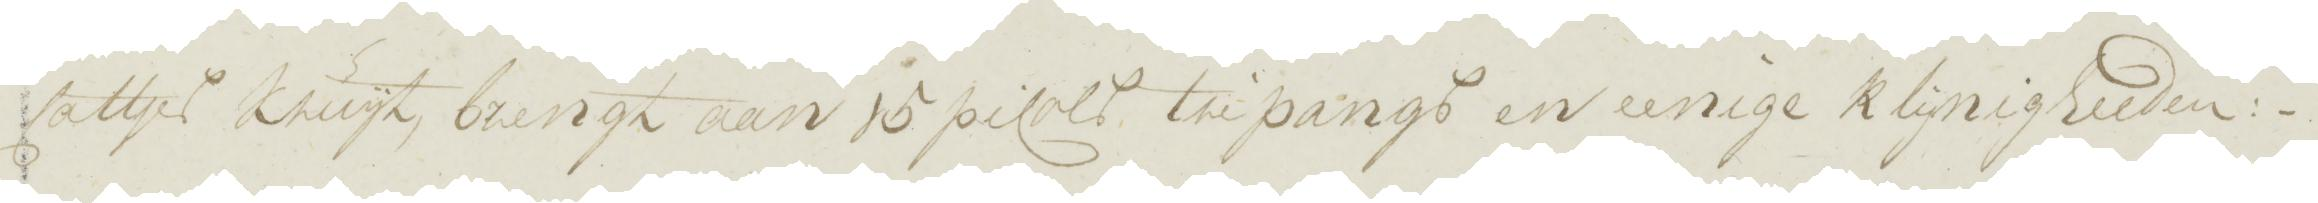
Cattjes kruijt, brengt aan 15 picols tripangs en eenige klijnigheeden: -
